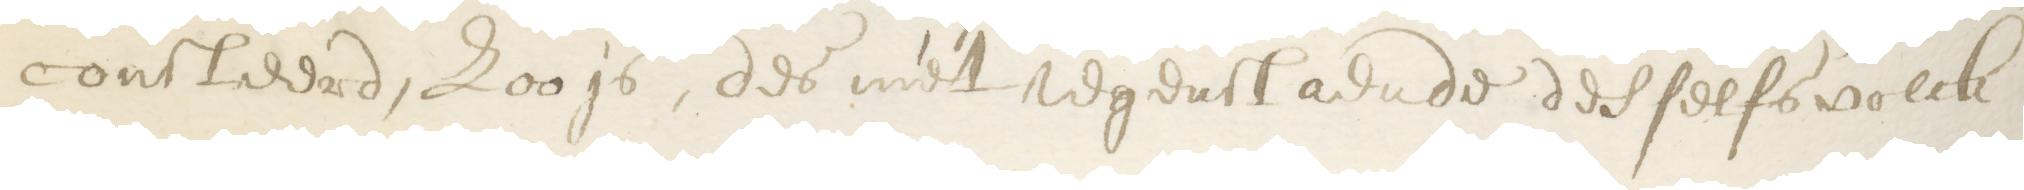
consteerd, zoo js, des niet tegenstaende desselfs volck
